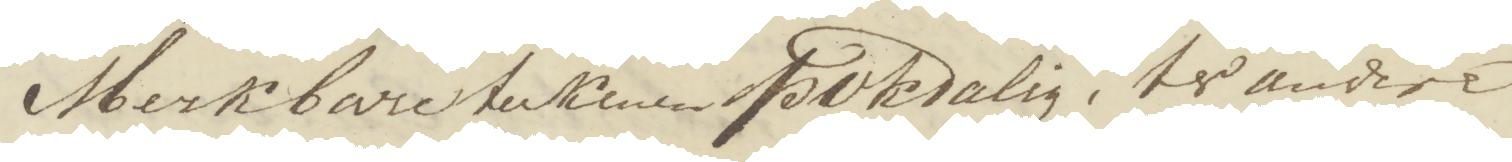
Merkbare tekenen Pokdalig, ter andere
